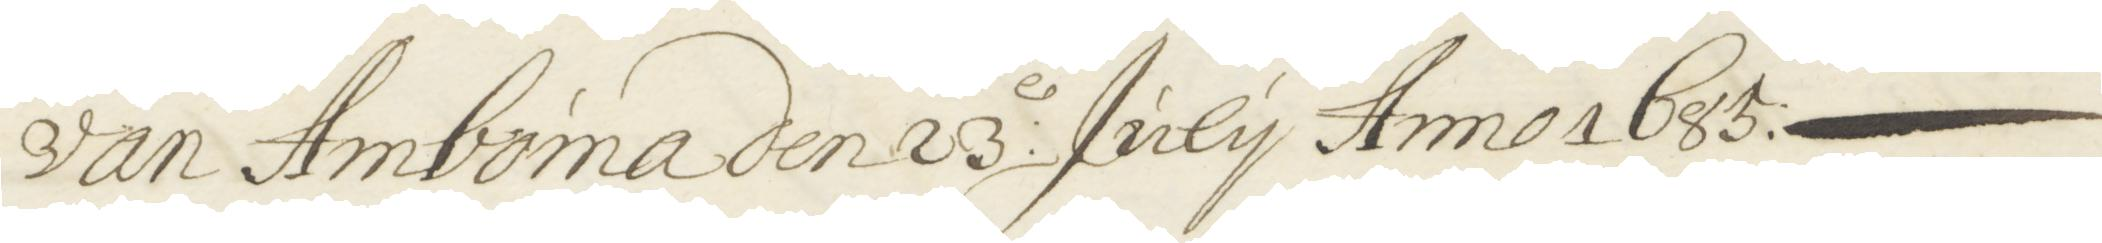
van Amboina den 23:e Julij Anno 1685: —
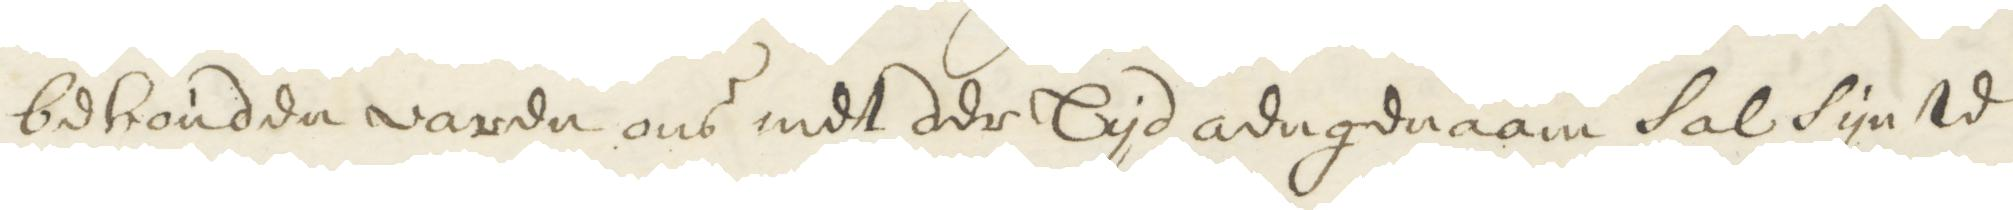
behouden varen ons met der Tijd aengenaam sal sijn te
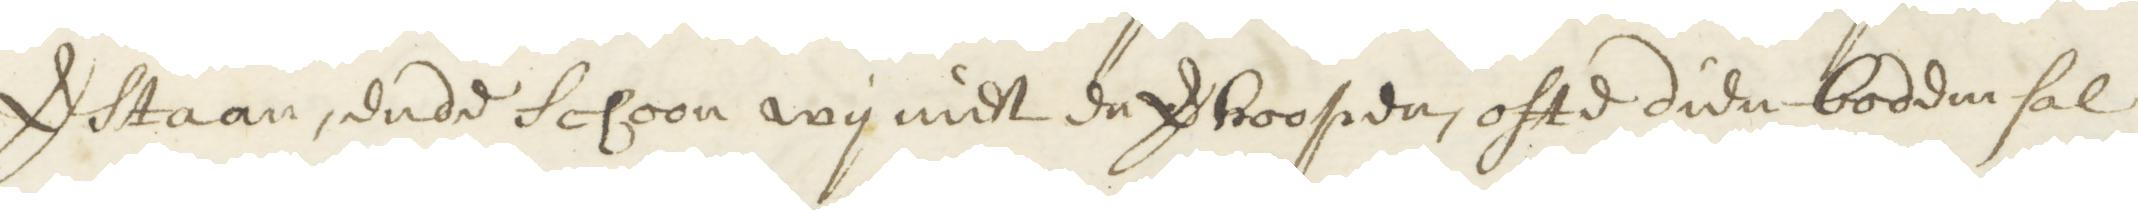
verstaan, ende schoon wij niet en verhoopen, ofte dien bodem sal
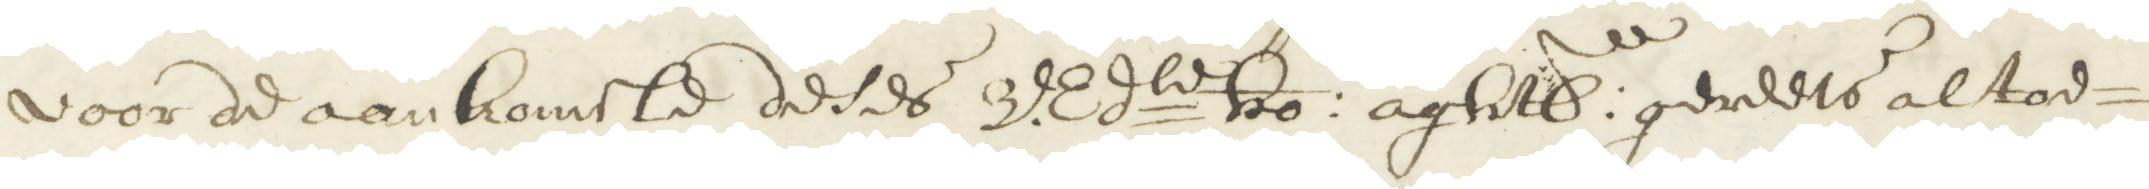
voor de aan komste deses V.Ed=le ho: aghtb:e gereets altoe„
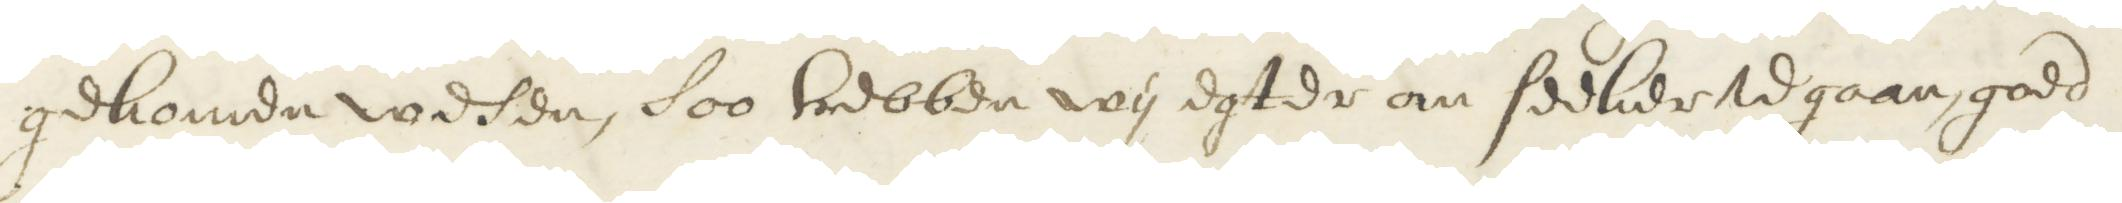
gekomen wesen, soo hebben wij egter om seeker te gaan, goed
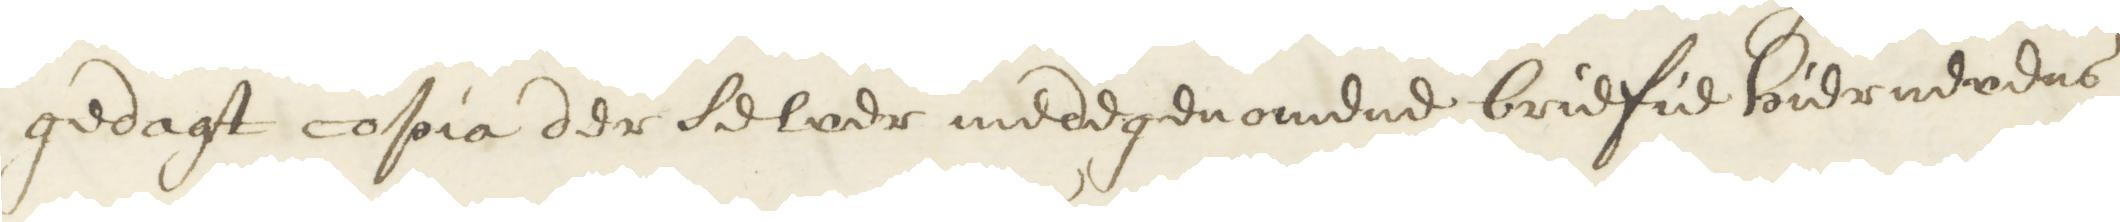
gedagt copia der selver medegenomene briefie hier nevens
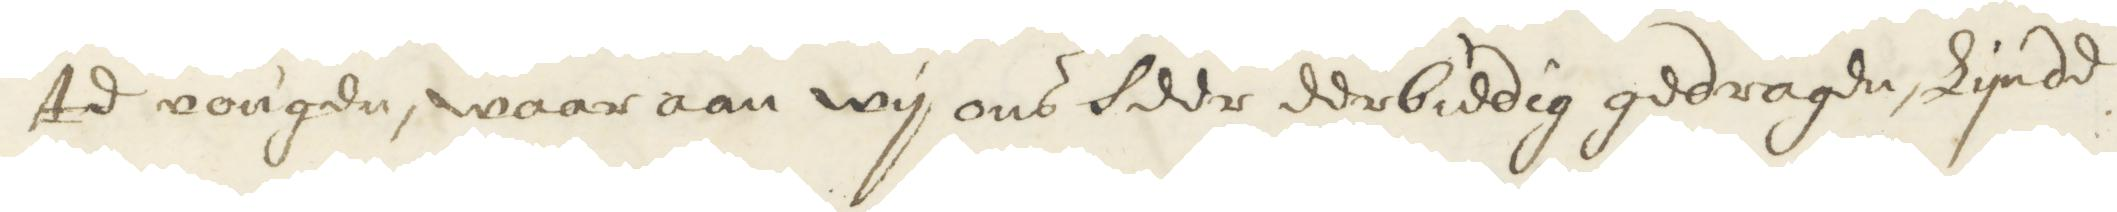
te vougen, waar aan wij ons seer eerbiedig gedragen, zijnde
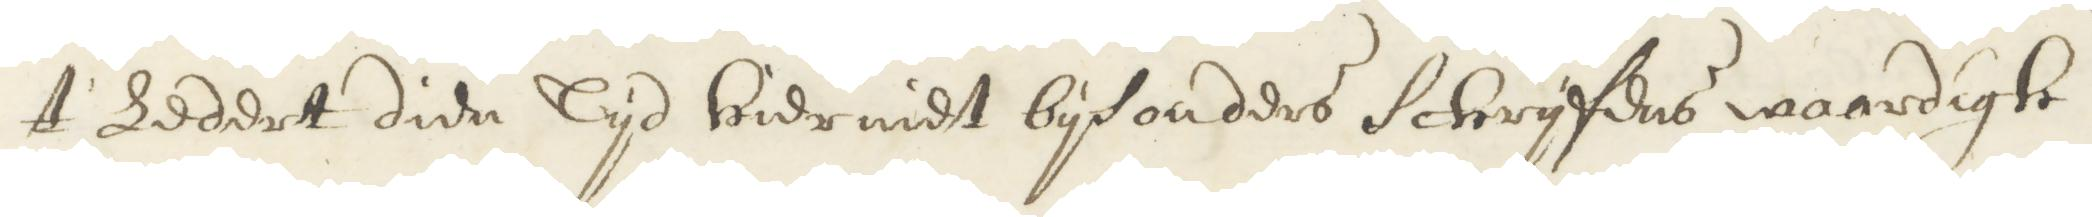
t’ zedert dien Tijd hier niet bijsonders schrijfens waardigh
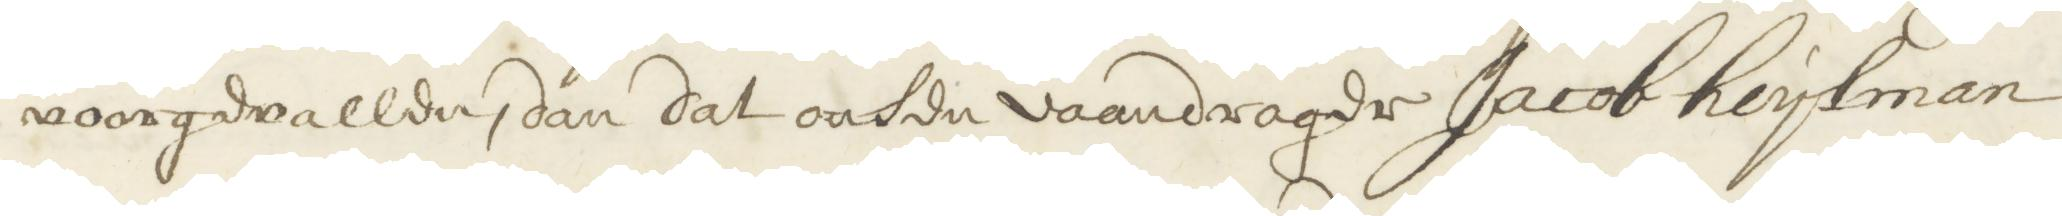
voorgevallen, dan dat onsen vaandrager Jacob heijlman
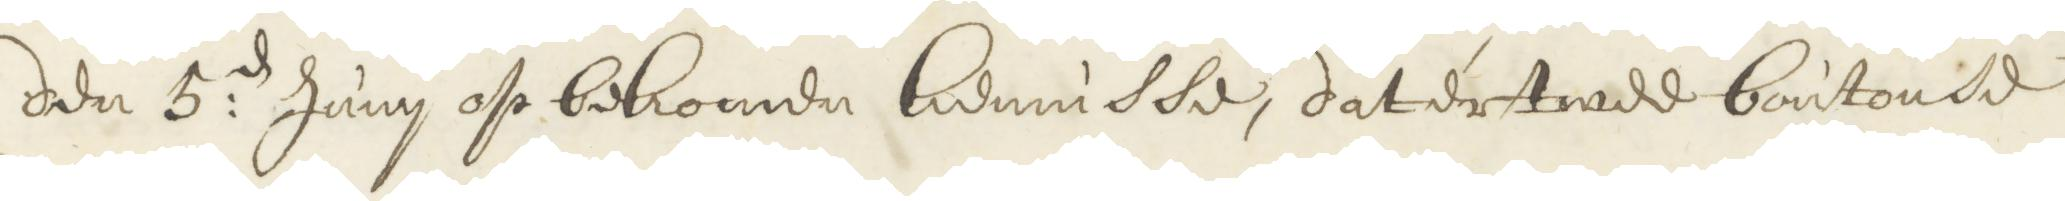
den 5:en Junij op bekomen kennisse, dat'er twee boutonse
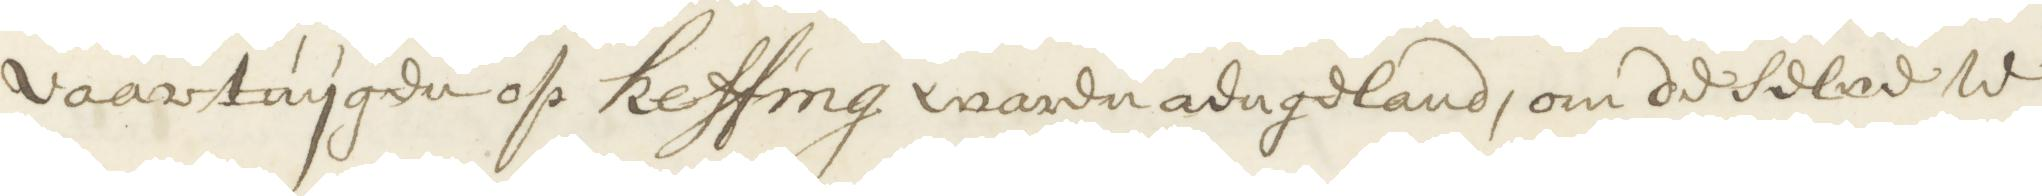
vaartuijgen op Keffing waren aengeland, om de selve te
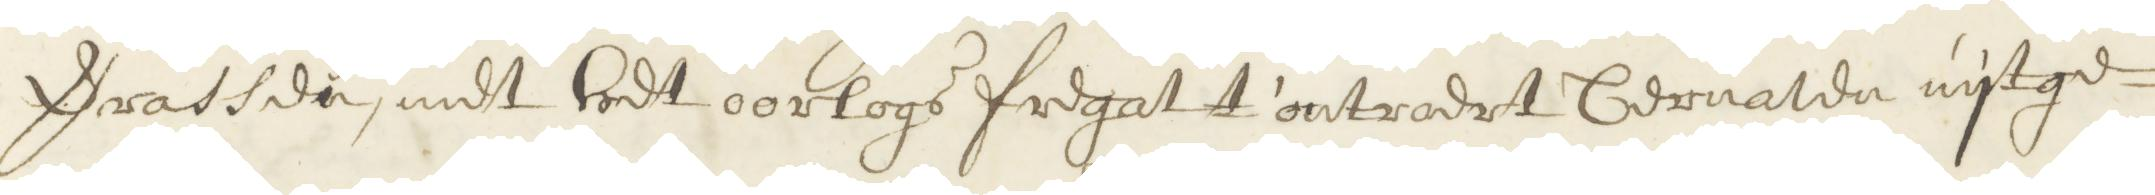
verrassen, met het oorlogs fregat t' ontroert Ternaten uijtge=
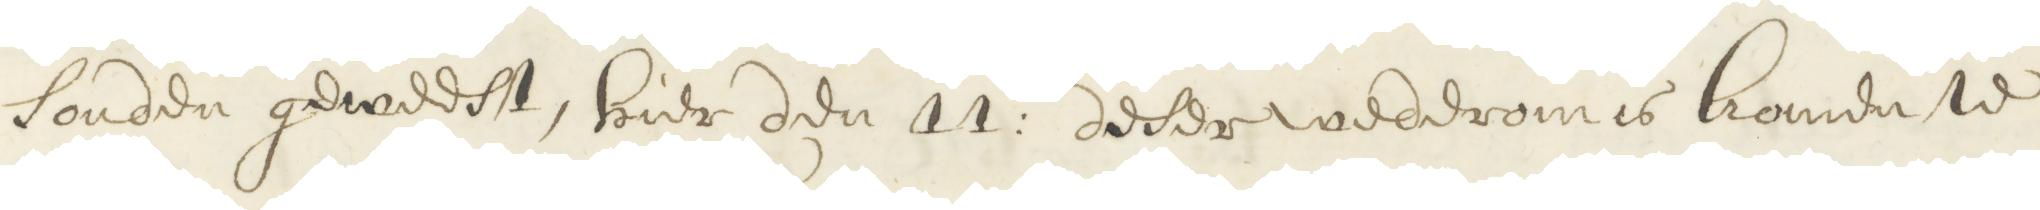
sonden geweest, hier den 11:en deser wederom is komen te
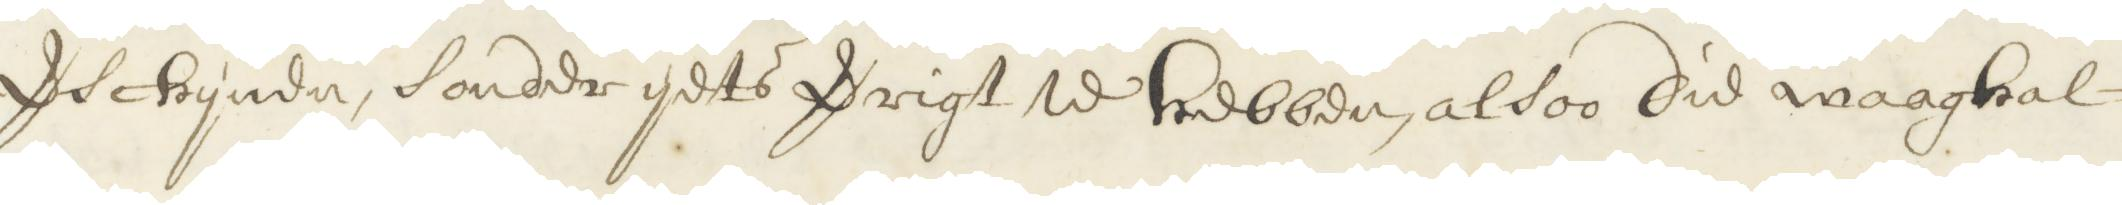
verschijnen, sonder ijets verrigt te hebben, alsoo die waaghal=
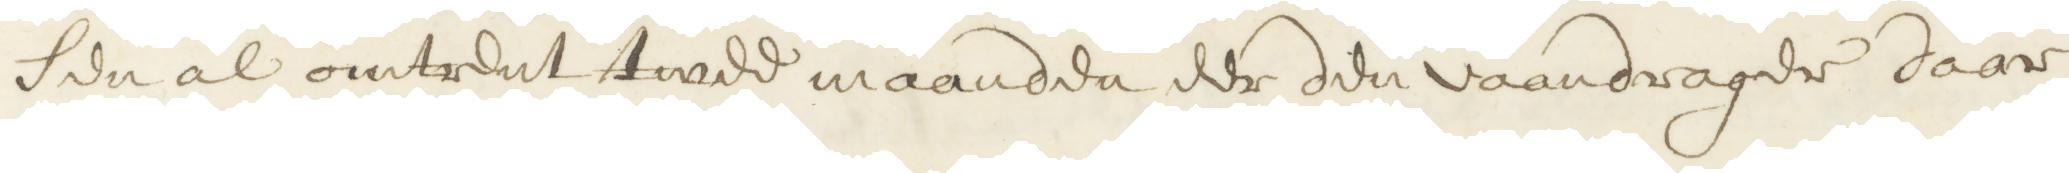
sen al omtrent twee maanden eer den vaandrager daar
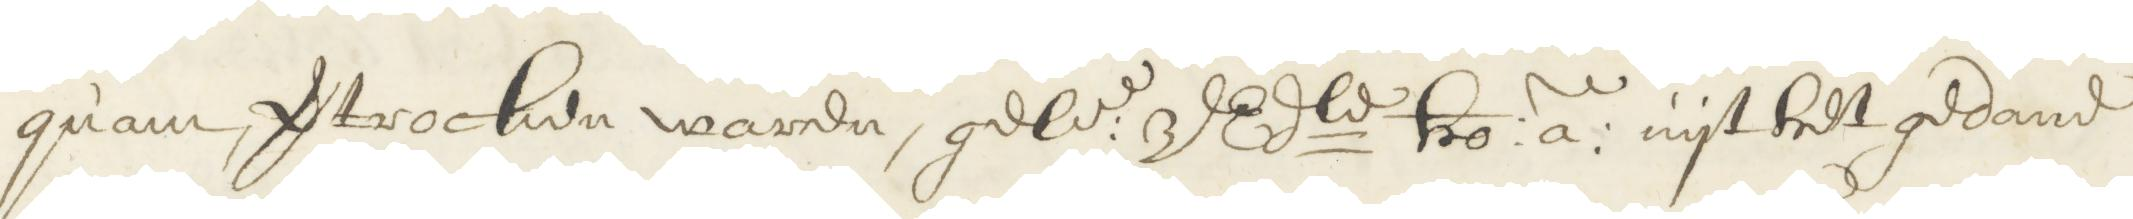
quam, vertrocken waren, gel: VEd=le ho: a:e uijt het gedane
